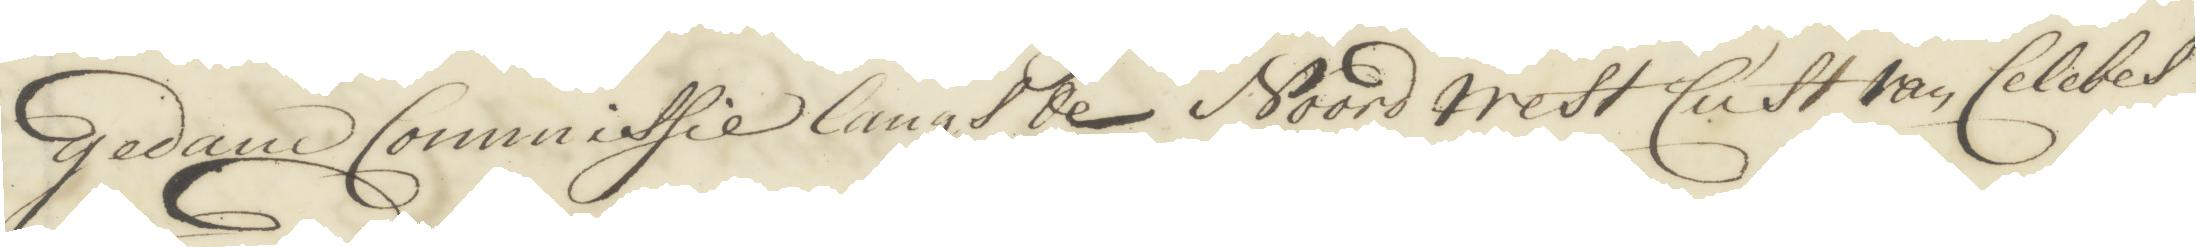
gedane Commissie lanns de Noord west Cust van Celebes
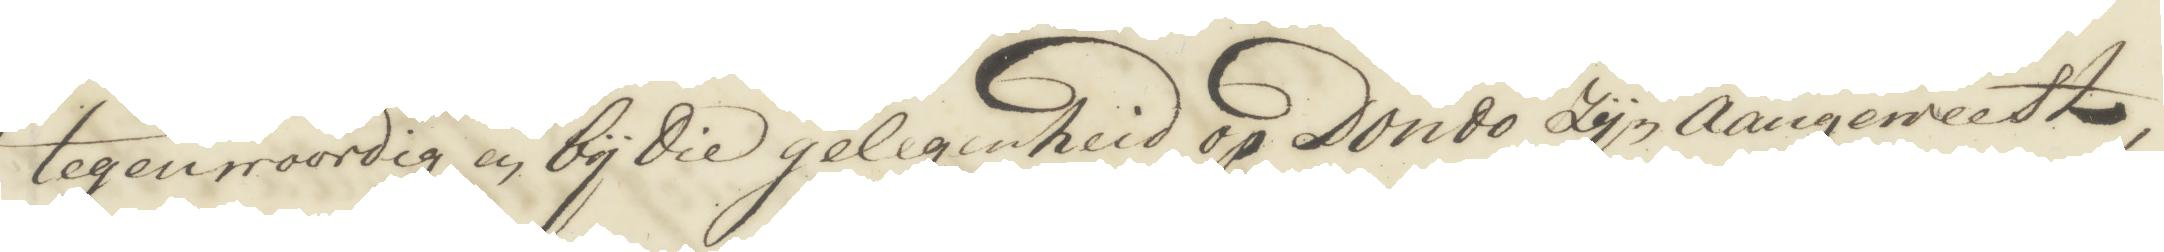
tegenwoordig en bij die gelegenheid op Dondo zijn aangeweest,
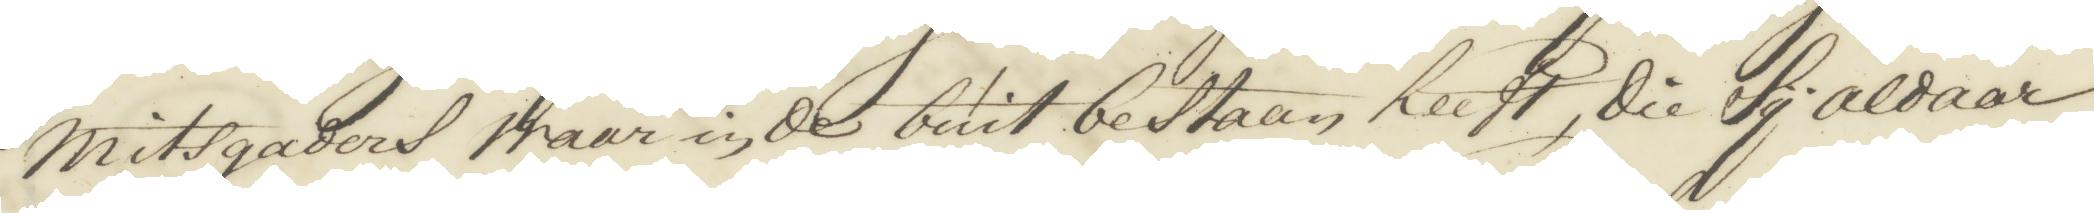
mitsgaders waar in de buit bestaan heeft, die Sij aldaar
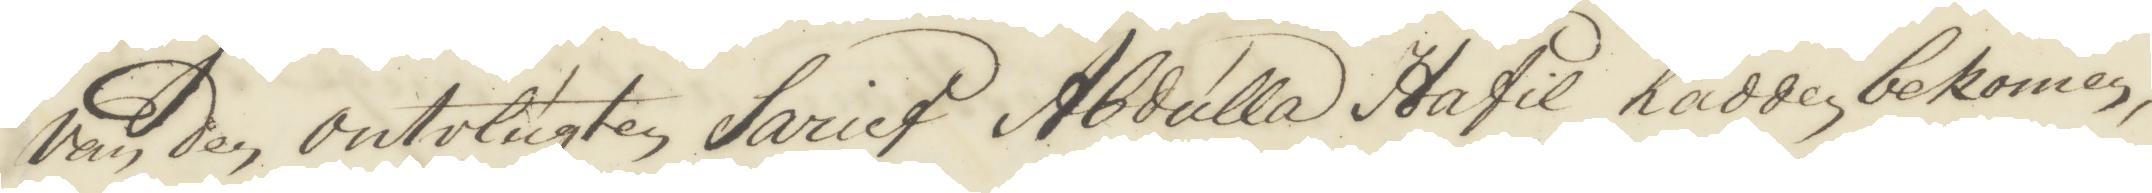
van den ontvlugten Sarief Abdulla Hafil hadden bekomen,
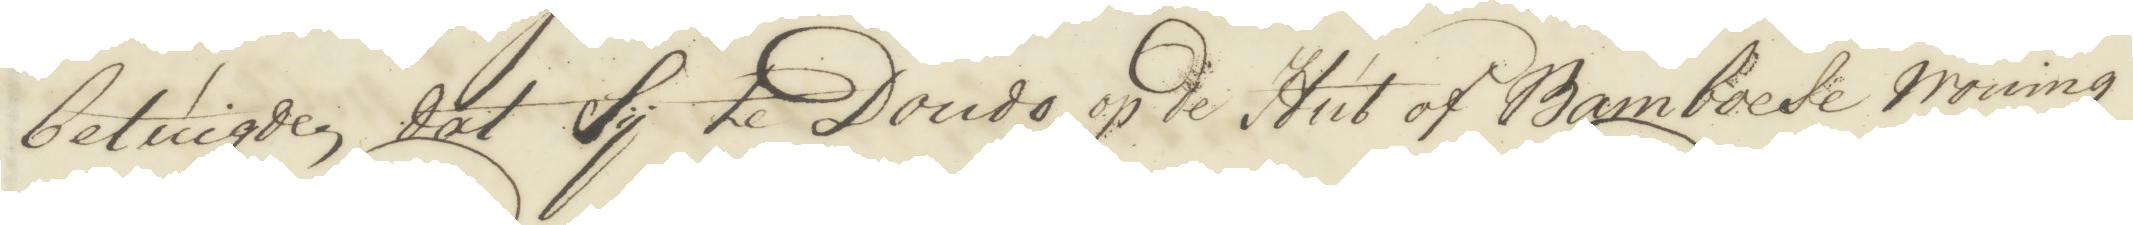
betuigden dat Sij te Dondo op de Hut of Bamboese woning
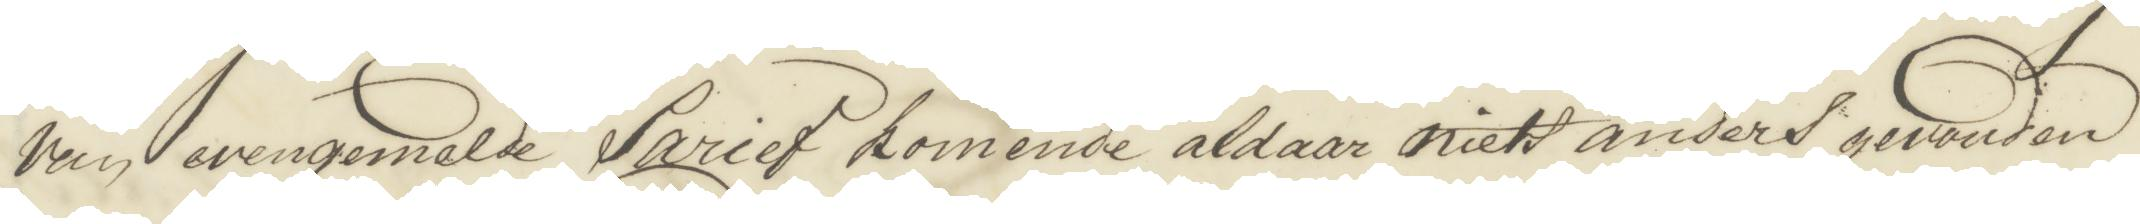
van evengemelde Sarief komende aldaar niets anders gevonden
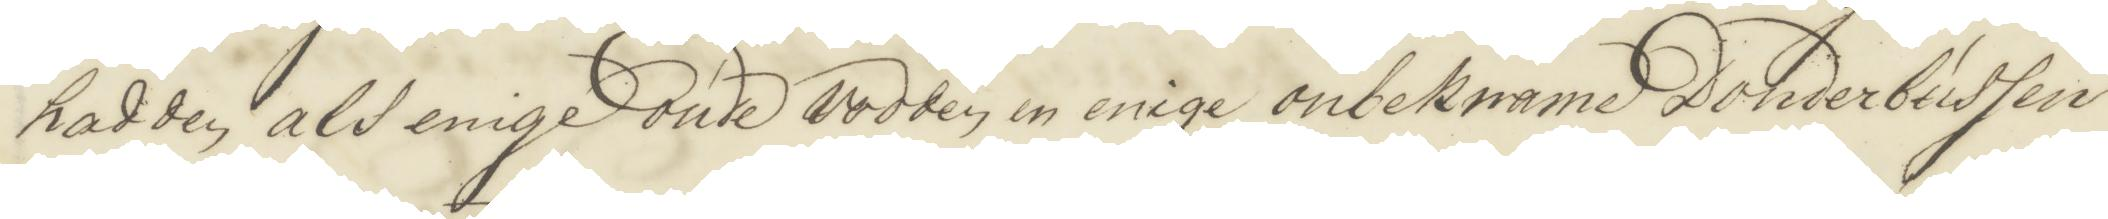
hadden als enige oude vodden en enige onbekwame Donderbussen
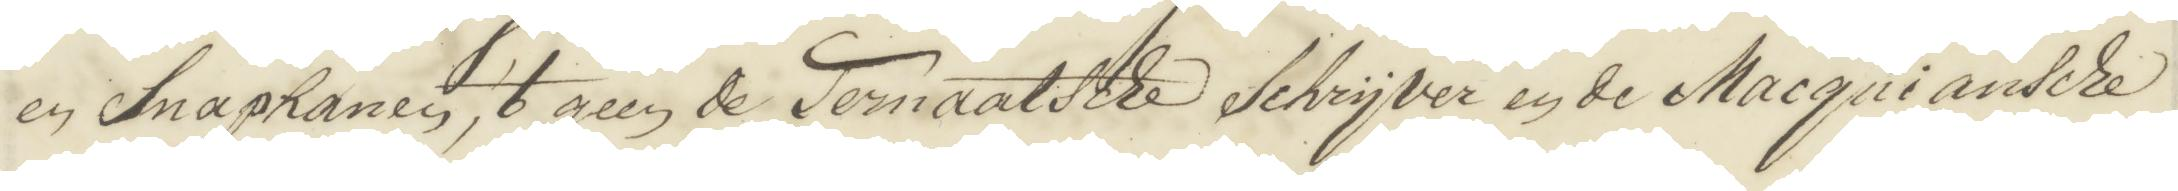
en Snaphanen, ’t geen de Ternaatsche Schrijver en de Macquiansche
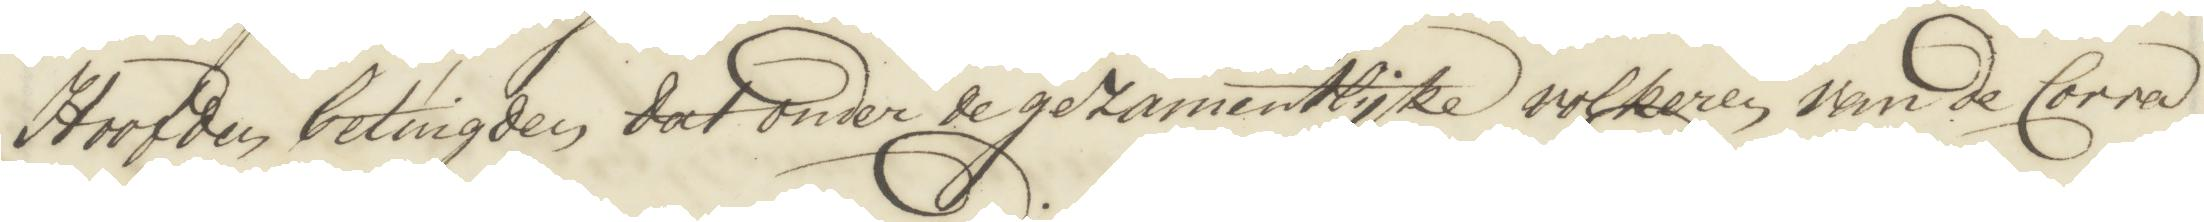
Hoofden betuigden dat onder de gezamentlijke volkeren van de Corra
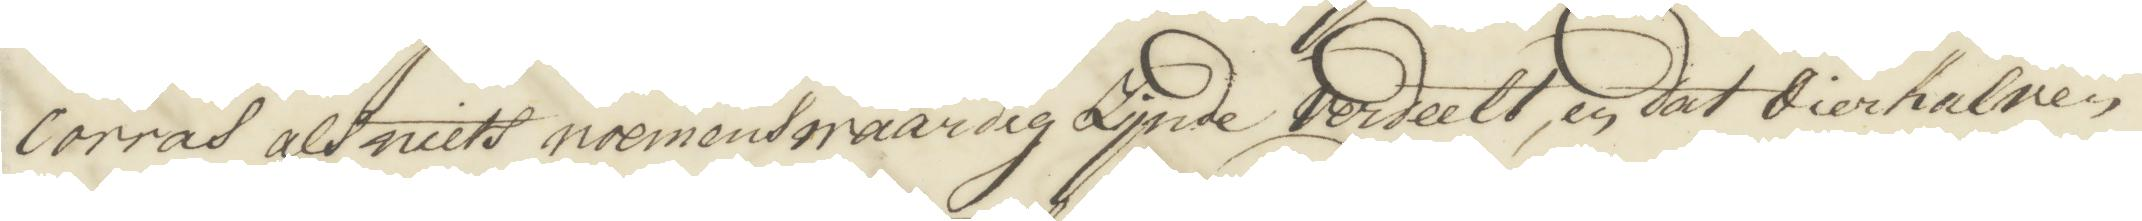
corras als niets noemens waardig Zijnde verdeelt, en dat dierhalven
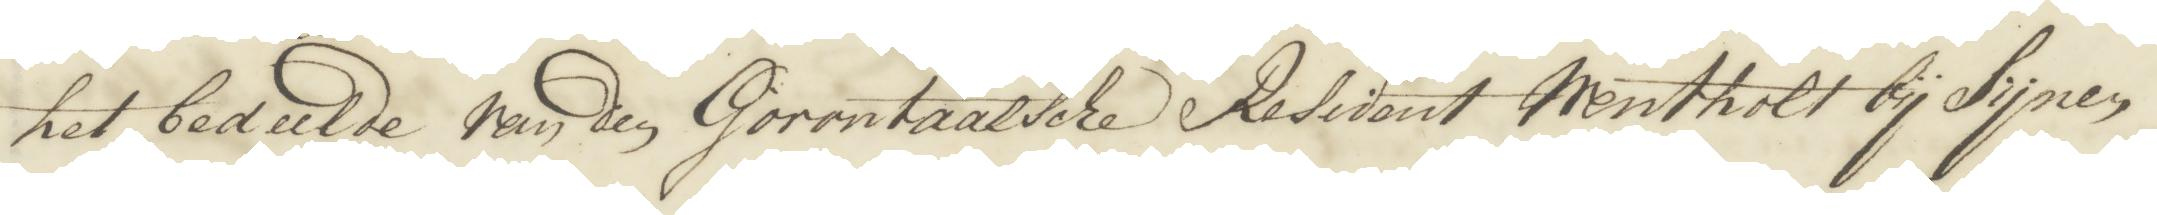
het bedeelde van den Gorontaalsche Resident Wentholt bij Sijnen
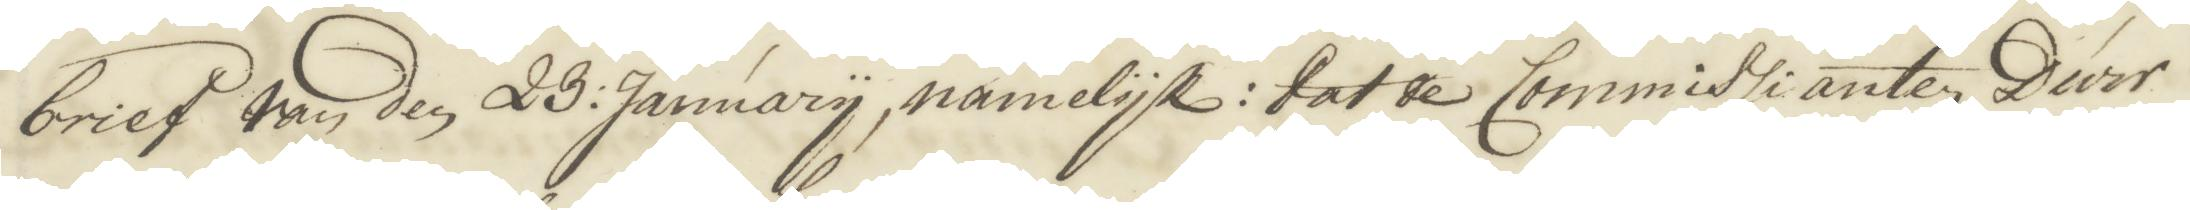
brief van den 23: Januarij, namelijk: dat de Commissianten Durr
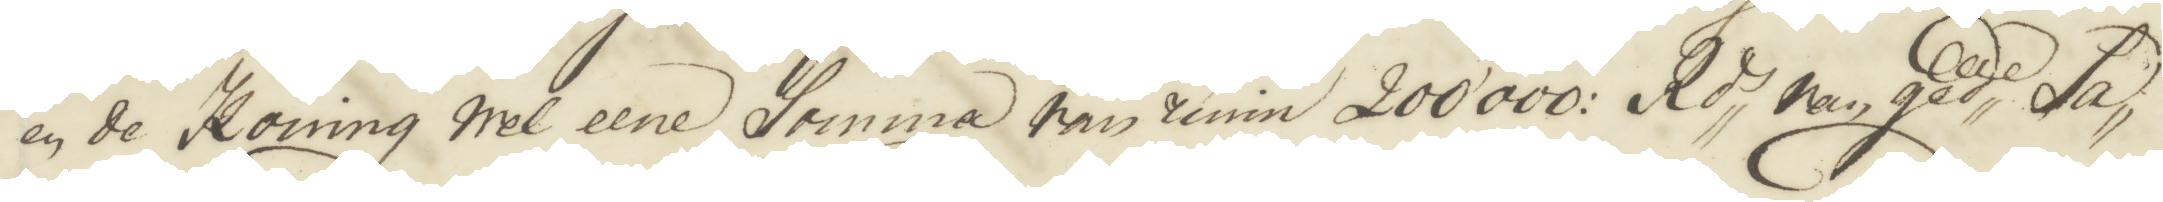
en de Koning wel eene Somma van ruim 200'000: Rd„s van ged„e Sa„
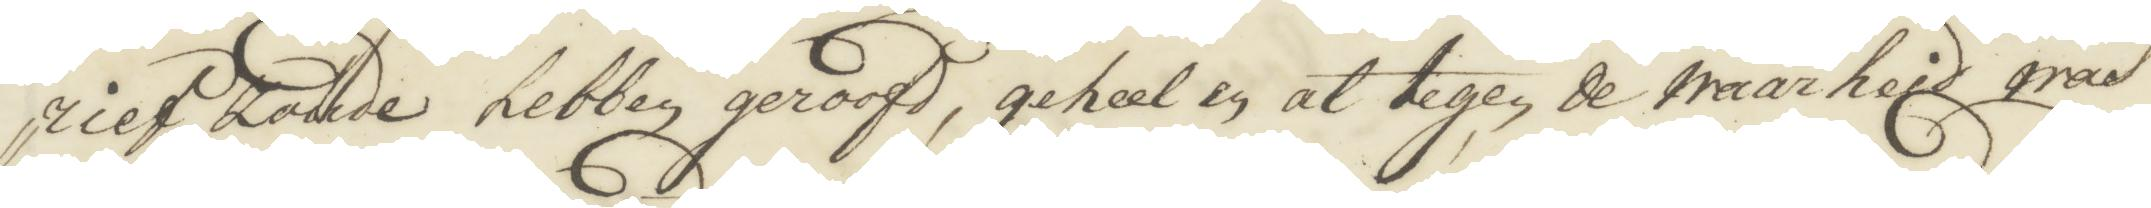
„rief Zoude hebben geroofd, geheel en al tegen de waarheid was
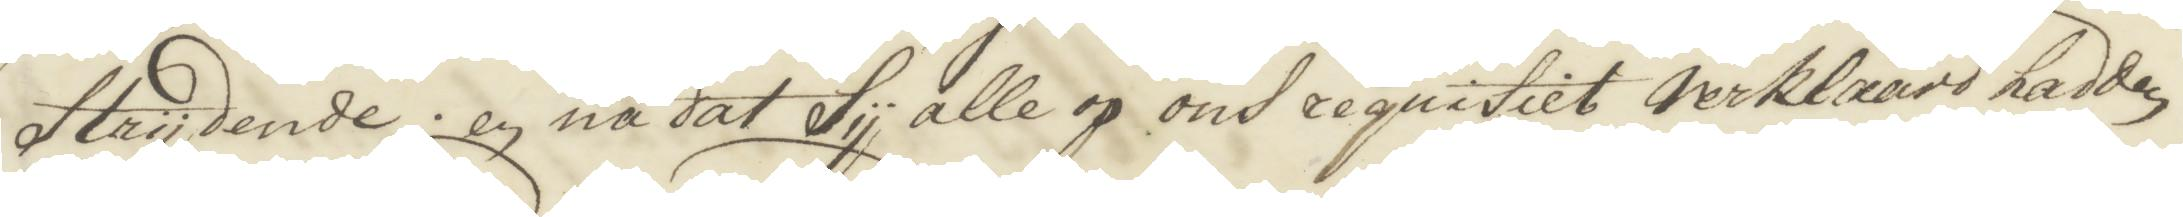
Strijdende. en na dat Sij alle op ons requisiet verklaard hadden
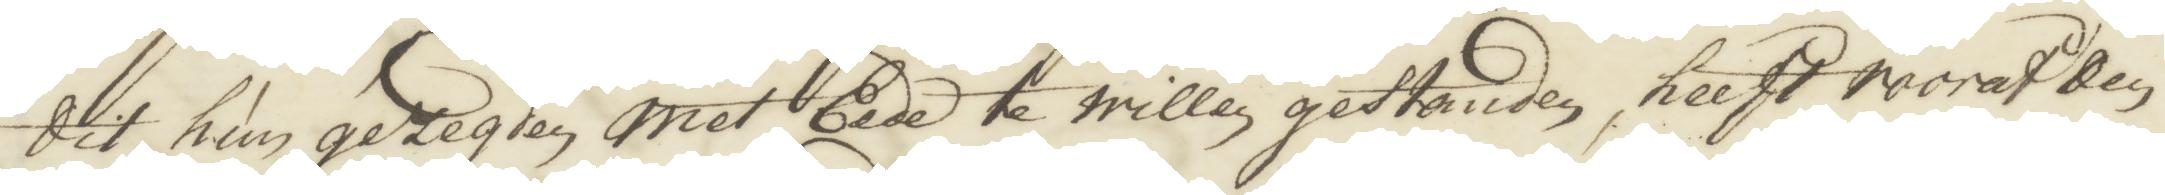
dit hun gezegden met Eede te willen gestanden, heeft vooraf den
